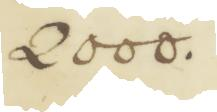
2000.
